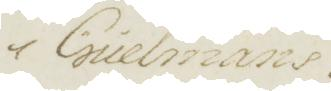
t Guelmans
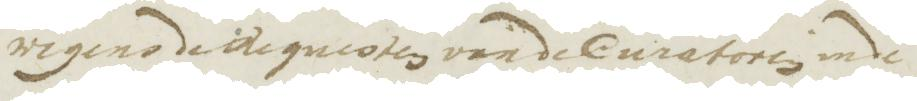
wegens de Requesten van de Curatoren in de
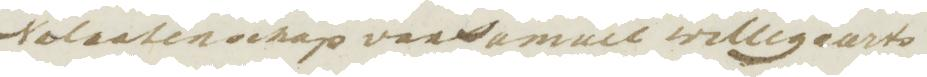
Nalaatenschap van samuel willegaarts
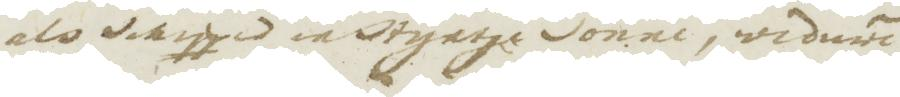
als schipper en Stijntje Sonne, weduwe
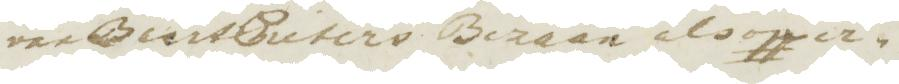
van Bart Pieters Bezaan als opper„
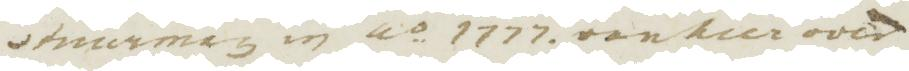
stuurman in a„o 1777. van hier over
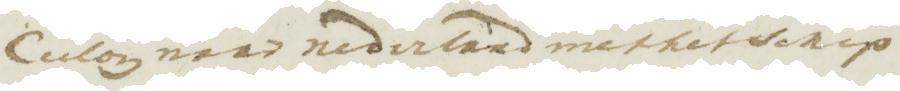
Ceilon naar nederland met het schip
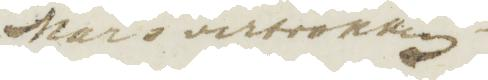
Mars vertrokken
